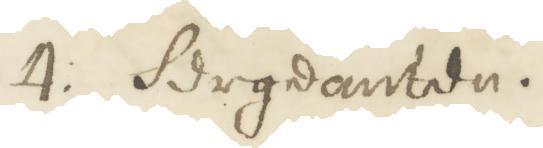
4: sergeanten.
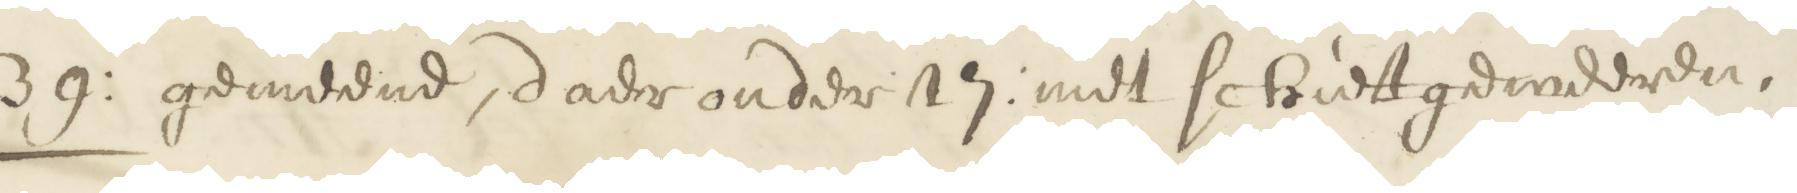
39: gemeene, daer onder 17: met schietgeweeren.
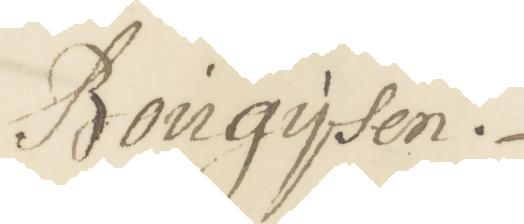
Bougijsen.
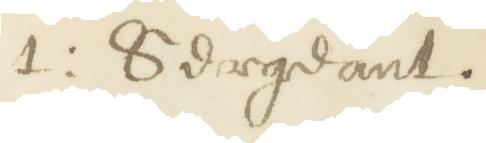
1: Sergeant.
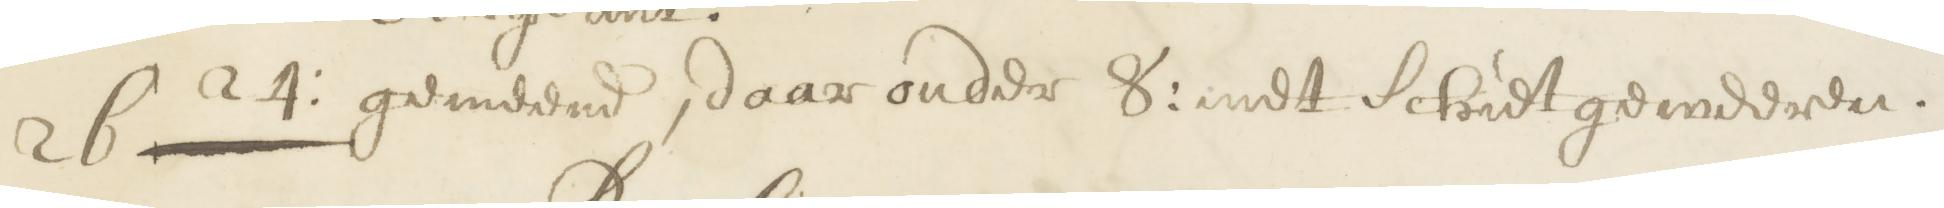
26 24: gemeene, daar onder 8: met schietgeweeren.
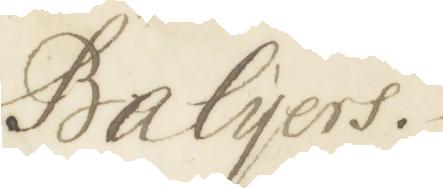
Balijers.
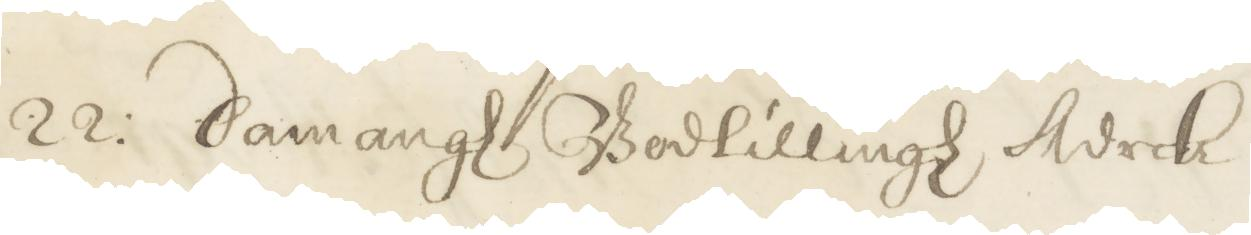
22. bamangh Boelillingh sterck
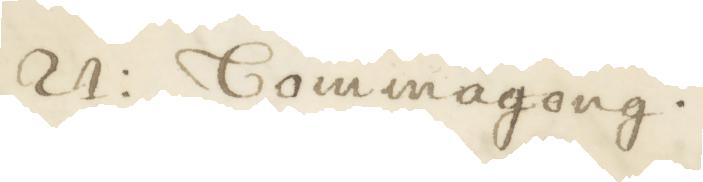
24. Tommagong.
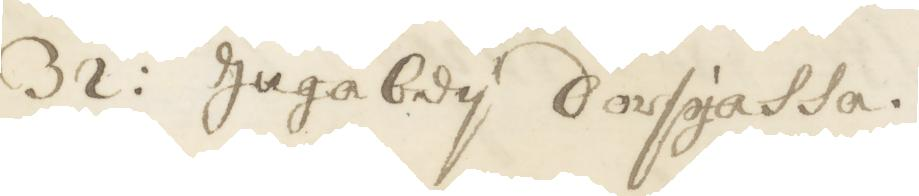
32: Jngabeij dorpjassa.
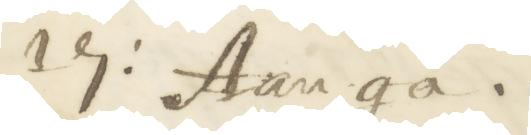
17: Aanga.
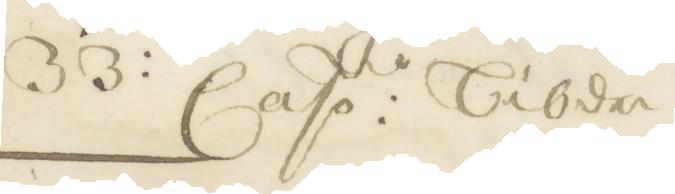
33: Cap:ns Tiben
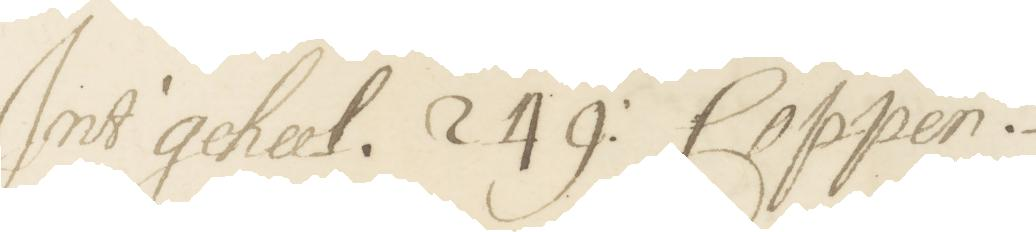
Jnt' geheel. 249: Coppen.—
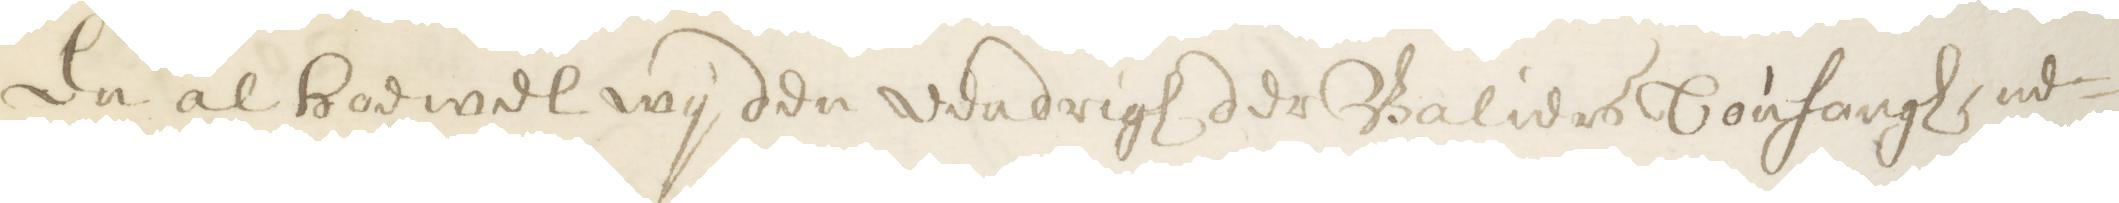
En al hoewel wij den vendrigh der Baliers Tousangh ne=
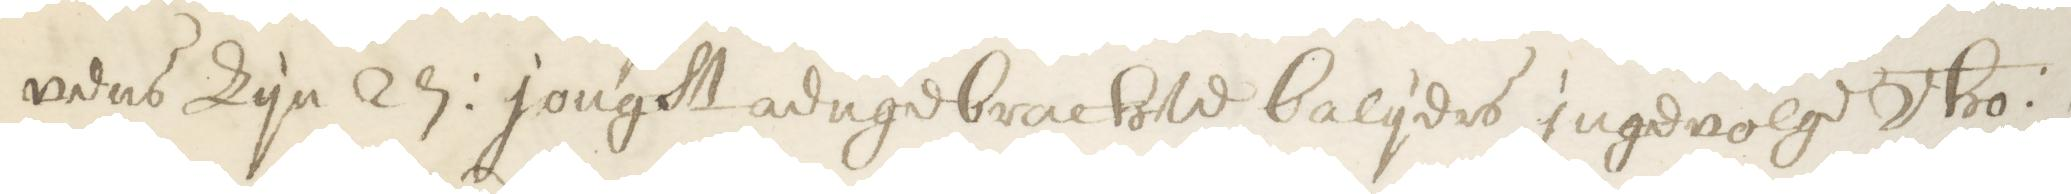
vens zijn 27: jongst aengebrachte balijers ingevolge Uho:
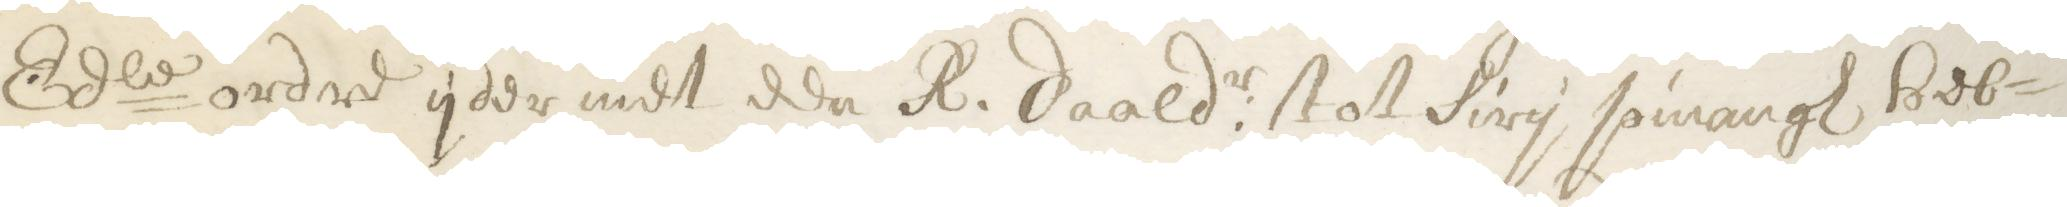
Ed=le ordre ijder met een R. daald:r tot sirij pinangh heb=
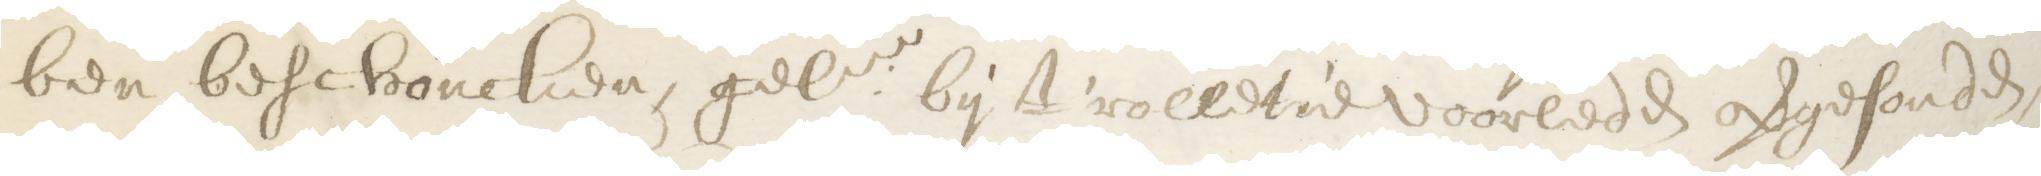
ben beschoncken, gel: bij t' rolletie voorleden overgesonden,
